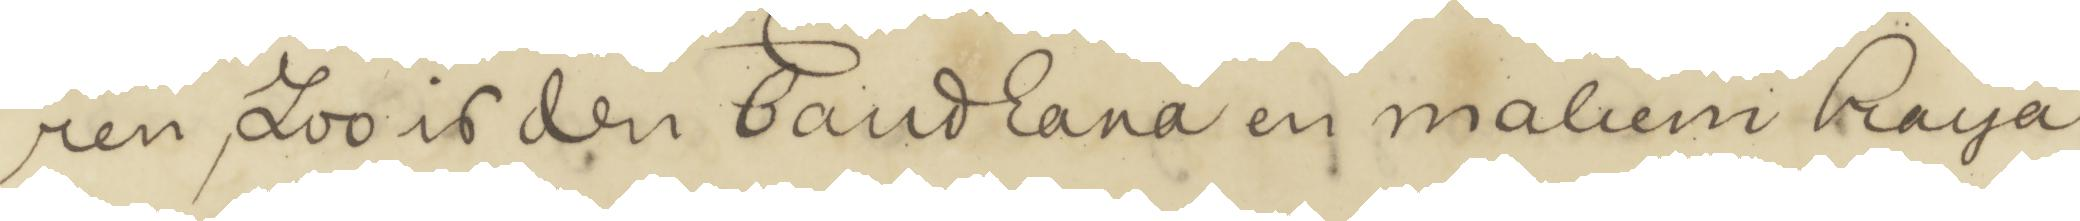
ren, Zoo is den bandhara en maliem kaija
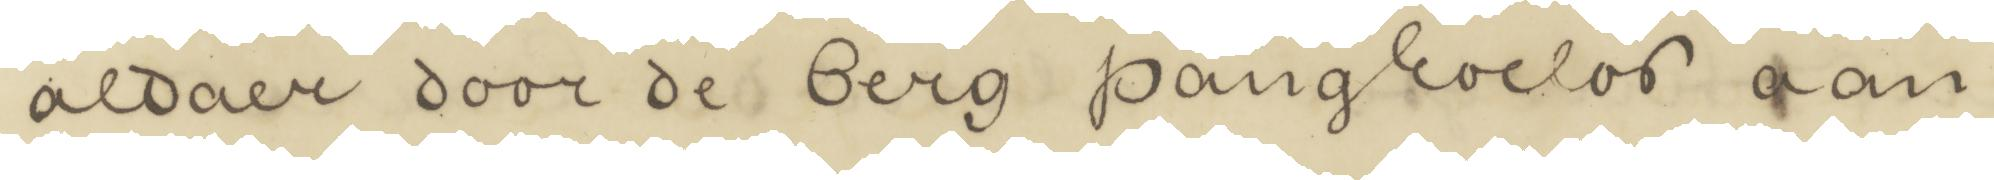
aldaer door de berg panghoelos aan
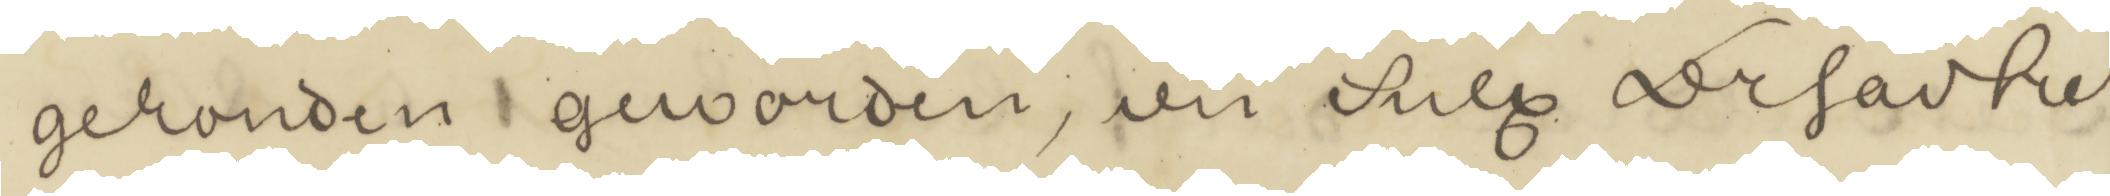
gehouden geworden; en sulx Tersaeke
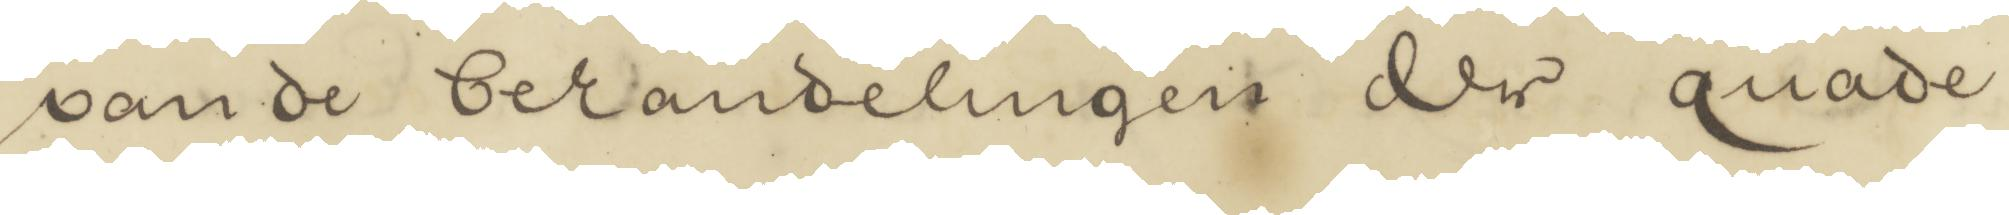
van de behandelingen der quade
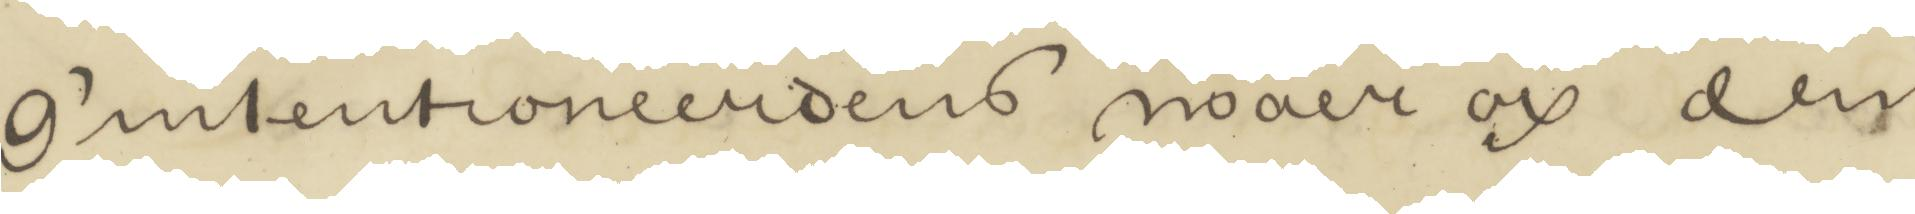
g'intentioneerdens waer op den
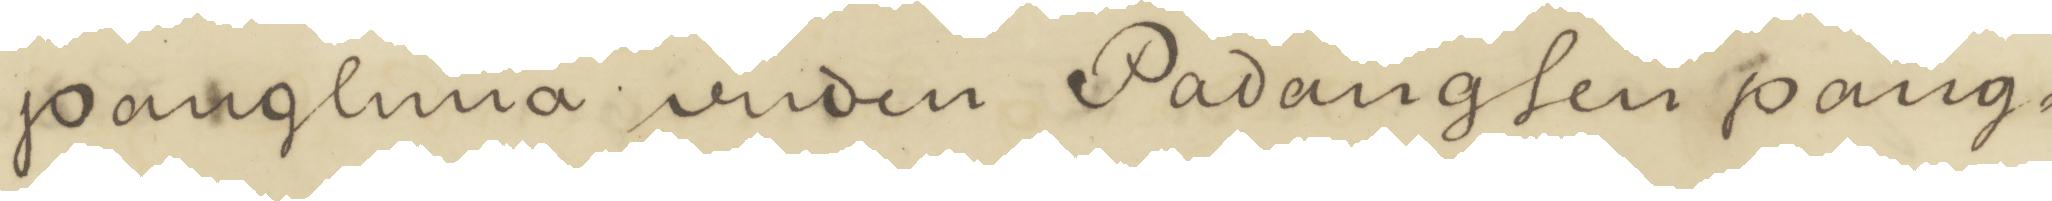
panglima enden Padangsen pang„
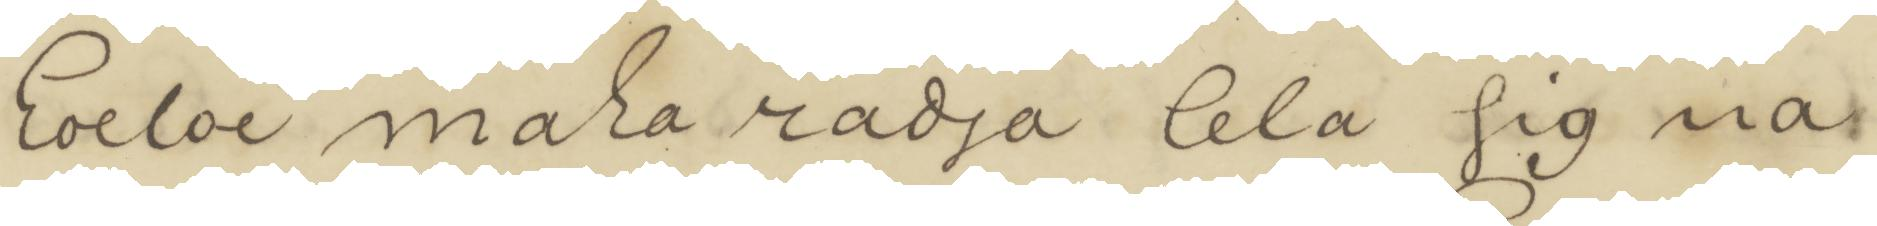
hoeloe maha radja lela sig na
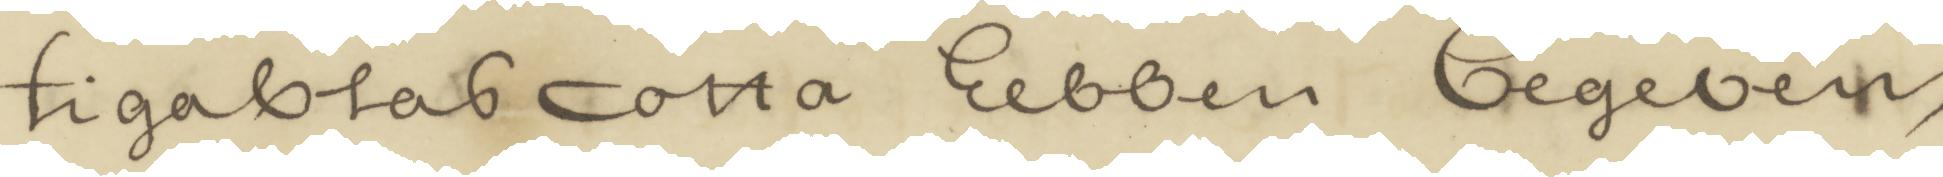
tigablas cotta hebben begeven,
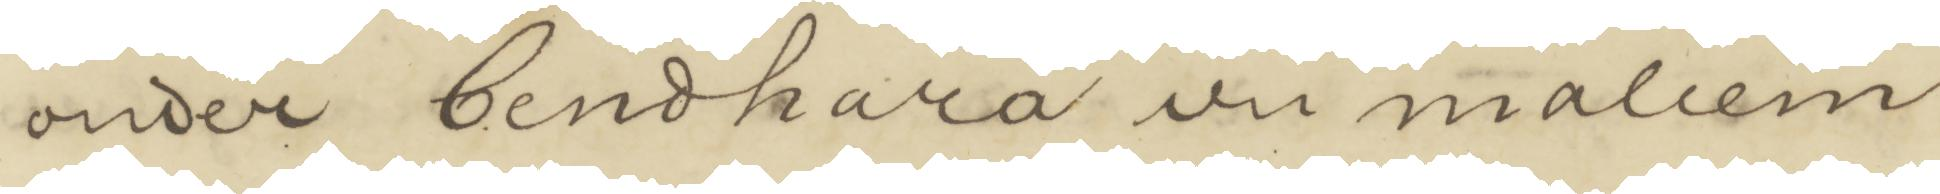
onder bendhara en maliem
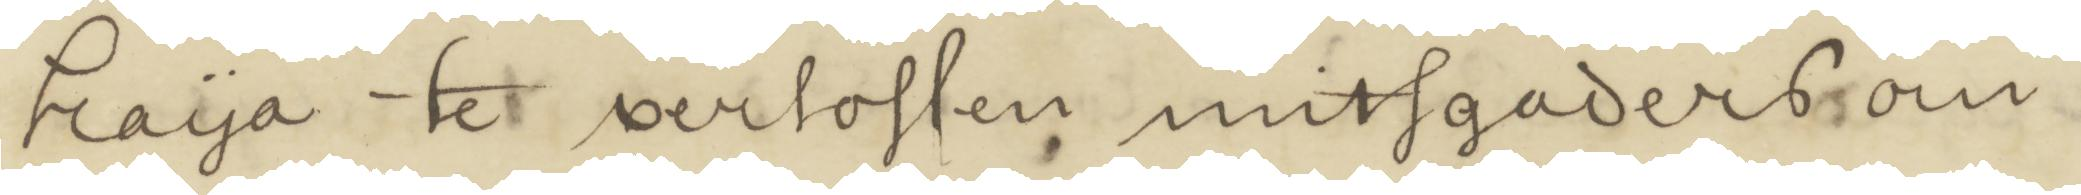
kaija te verlossen mitsgaders om
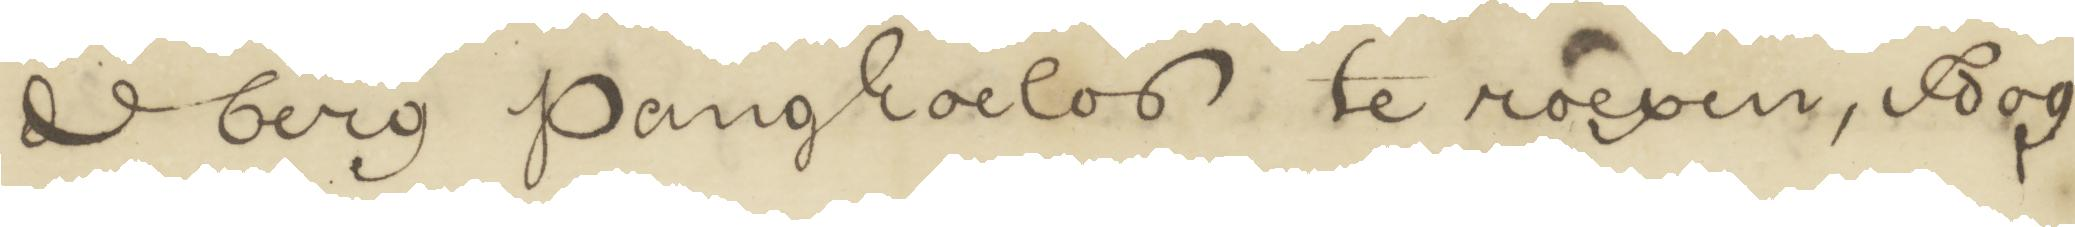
de Berg panghoelos te roepen, Edog
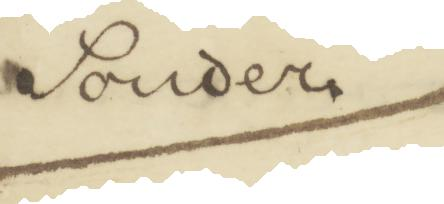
Sonder
